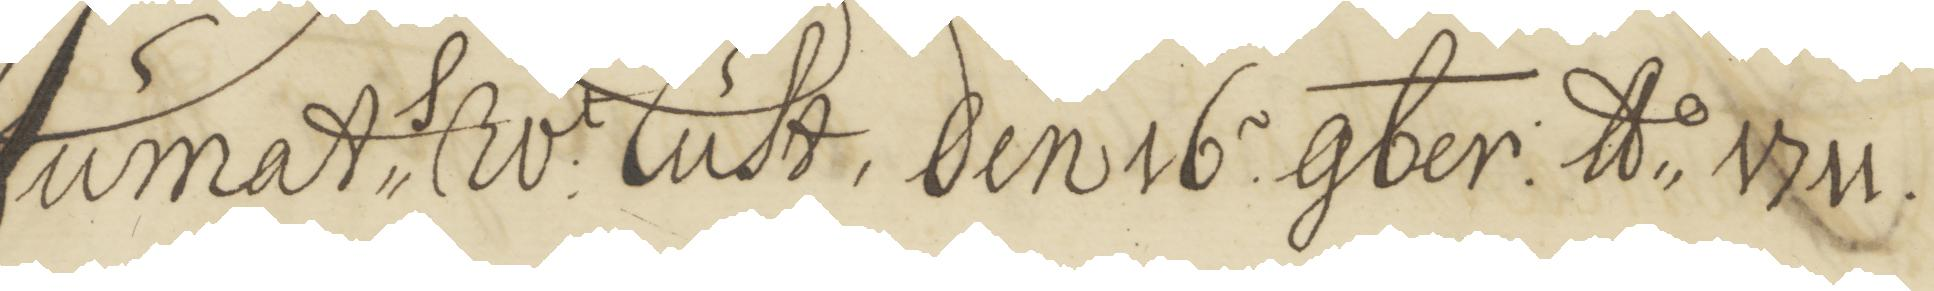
Van Sumat„s W:t Cust, den 16.' 9ber: A„o 1711.
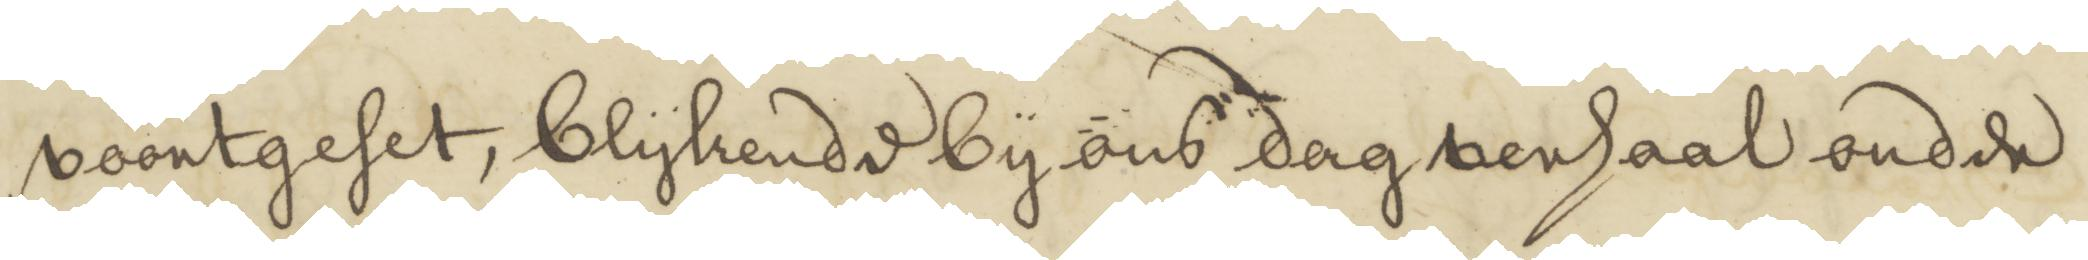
voortgeset, blijkende bij ons dag verhaal onder
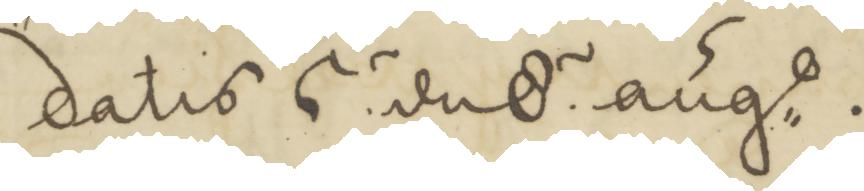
datis 5.' en 8.' aug„o.
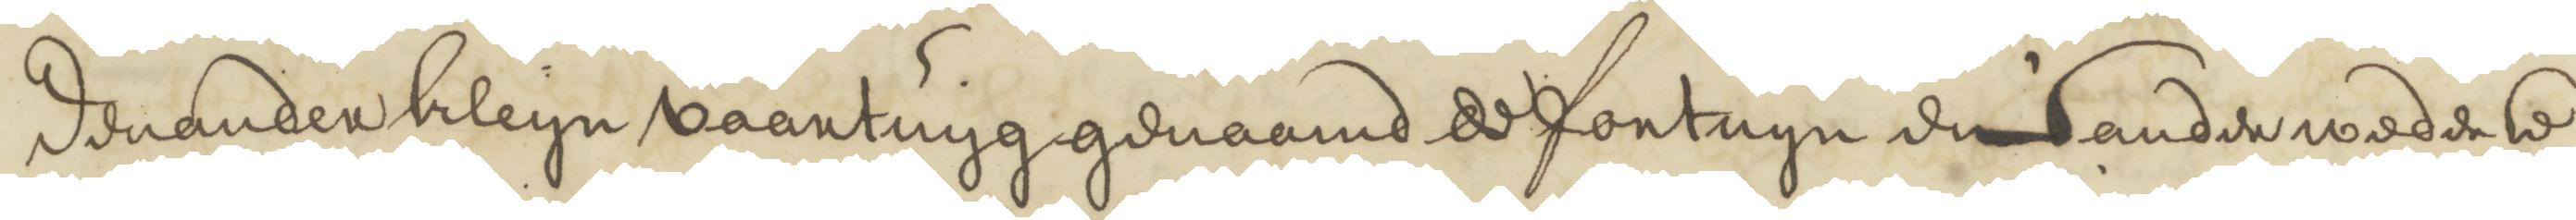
Een ander kleijn vaartuijg genaamd de fortuijn en ’t ander weder te
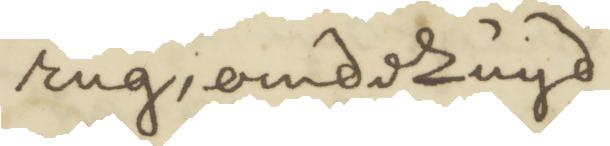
rug, om de zuijd
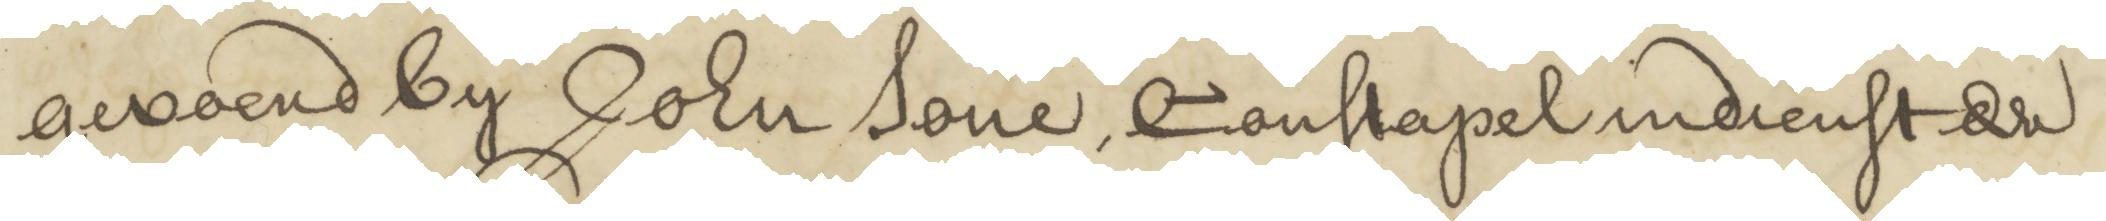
gevoerd bij John Sone, Constapel in dienst der
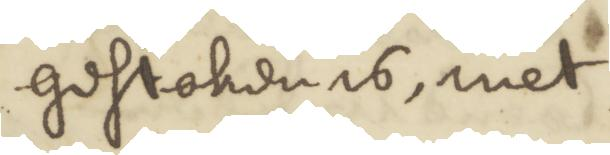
gestoken is, met
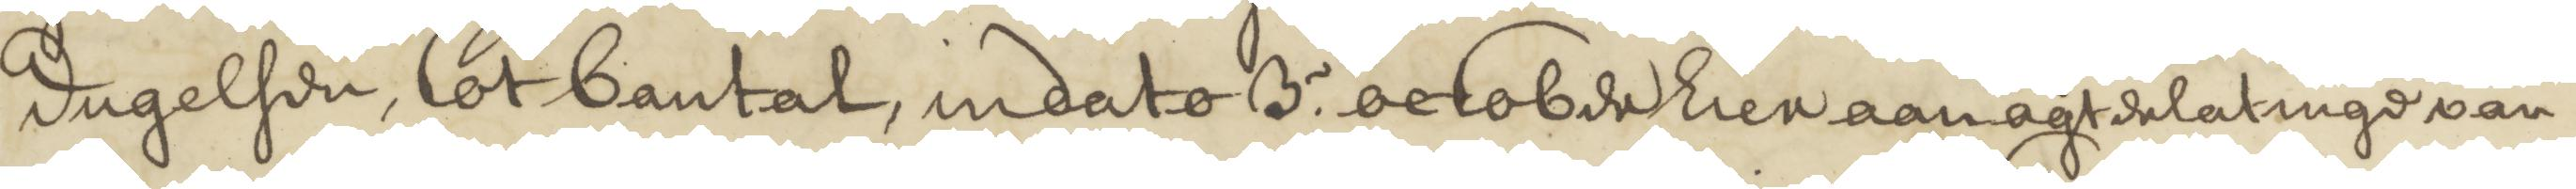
Engelsen, tot bantal, in dato 3.' october hier aan agterlatinge van
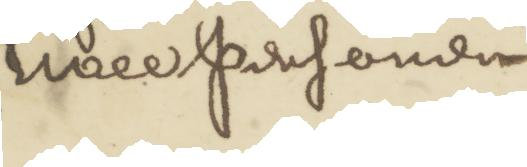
twee personen
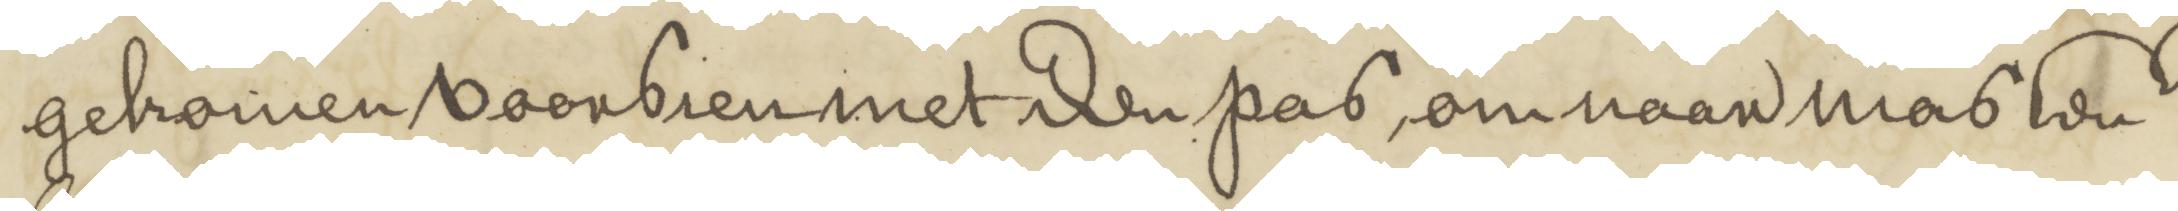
gekomen voorsien met een pas, om naar nias ten
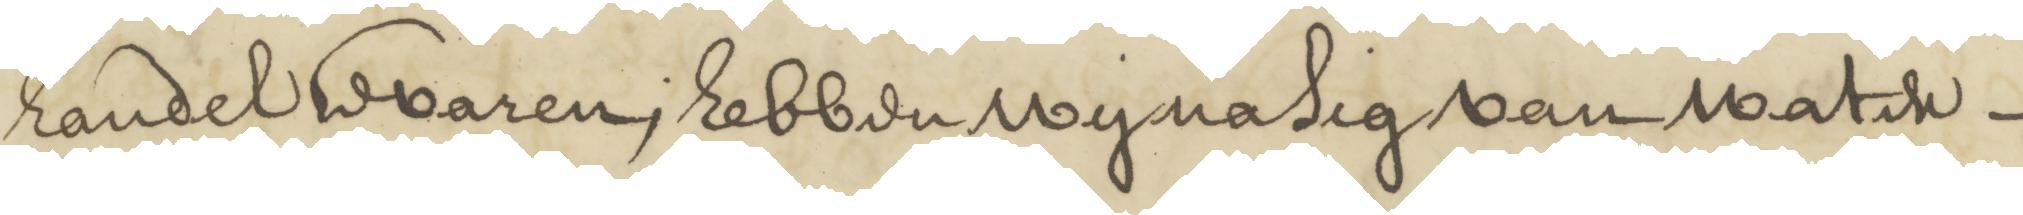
handel te varen; hebben wij na sig van water
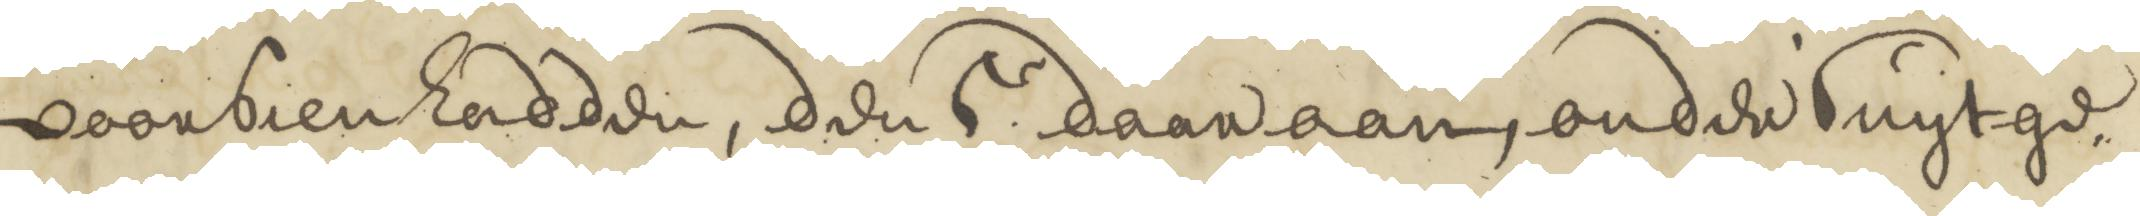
voorsien hadden, den 5. daar aan, onder ’s uijtge„
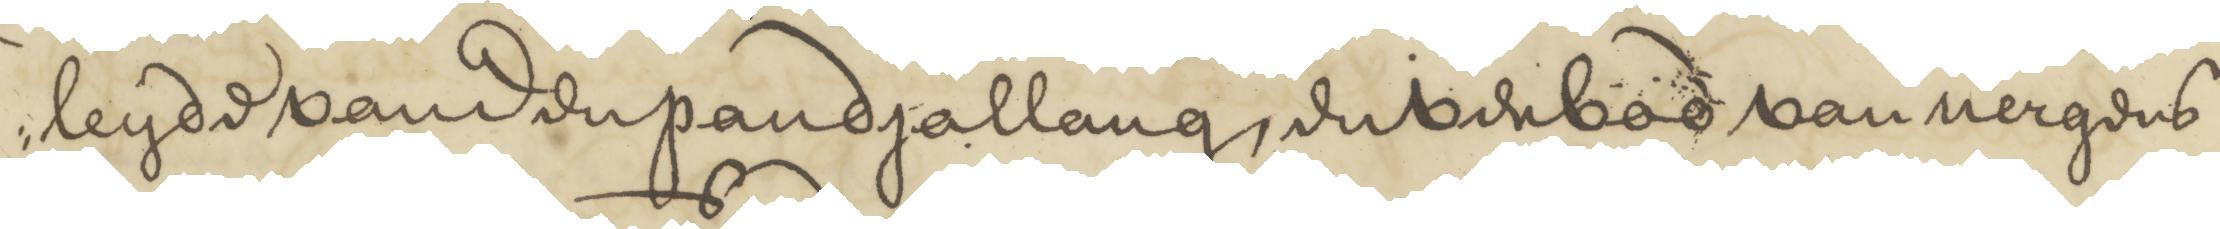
„leijde van Een pandjallang, en verbod van nergens
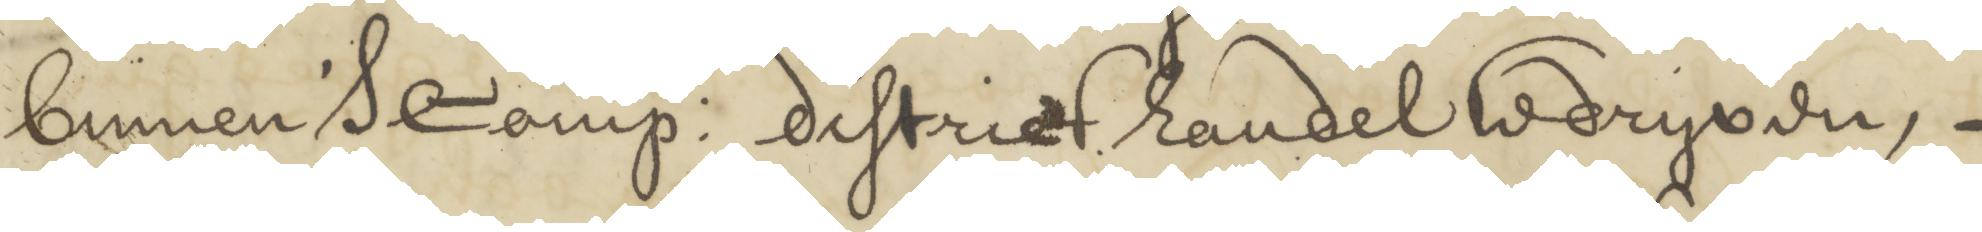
binnen ’s Comp:s district handel te drijven,
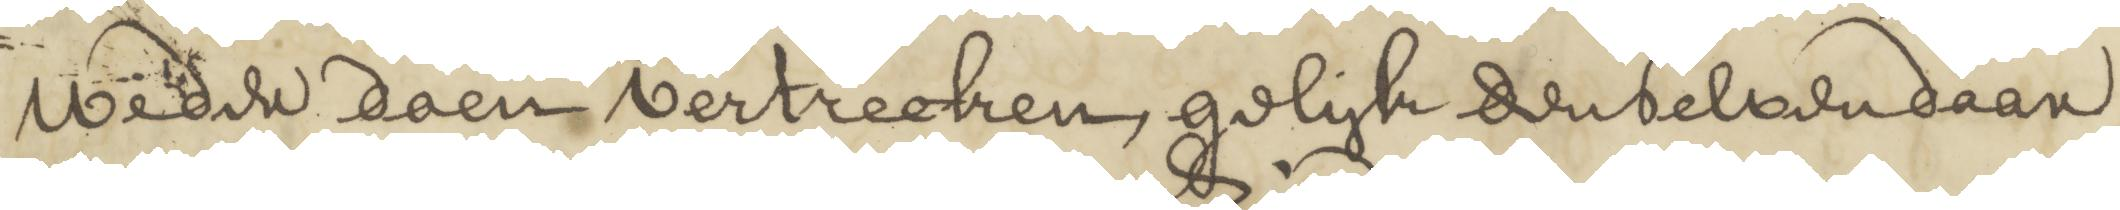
weder doen vertrecken, gelijk denselven daar
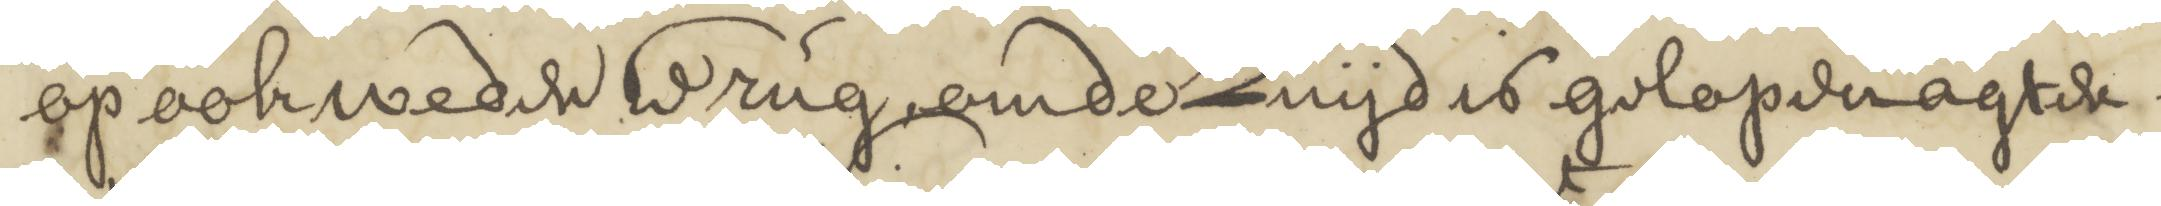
op ook weder te rug, om de Zuijd is gelopen agter
